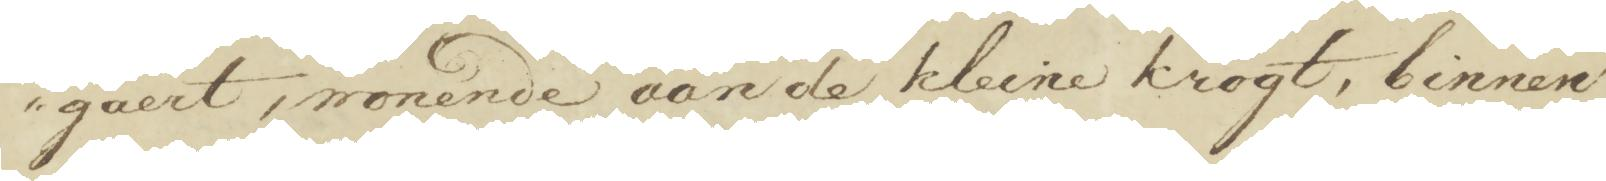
„gaert, wonende aan de kleine krogt, binnen
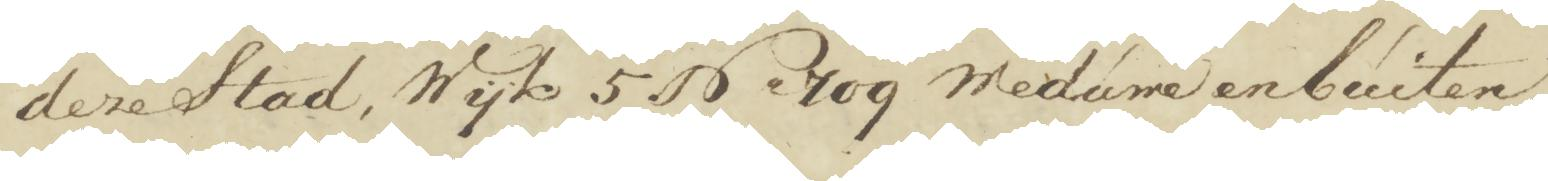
deze Stad, Wijk 5 N 709 weduwe enbuiten
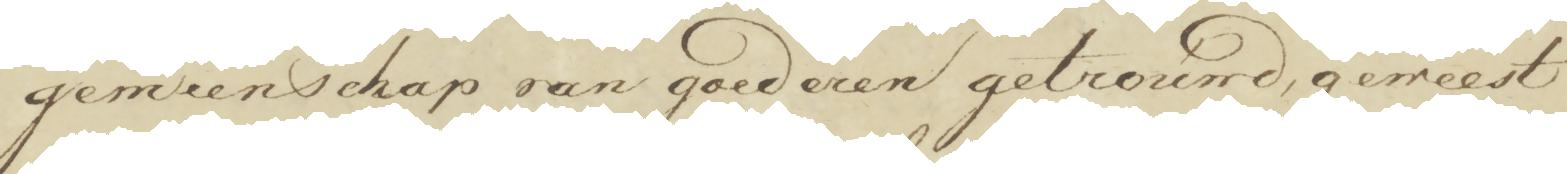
gemeenschap van goederen getrouwd, geweest
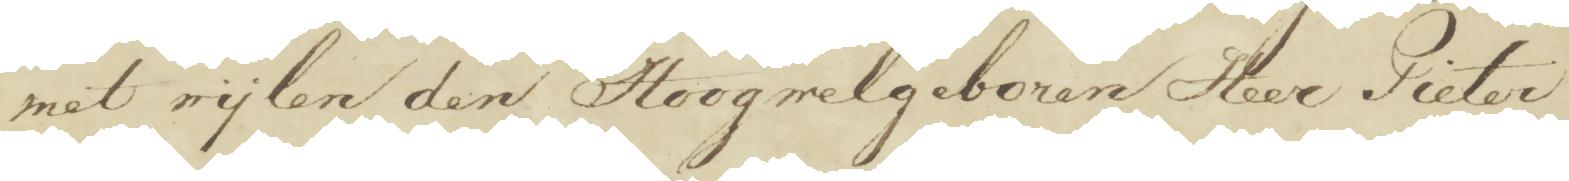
met wijlen den Hoogwelgeboren Heer Pieter
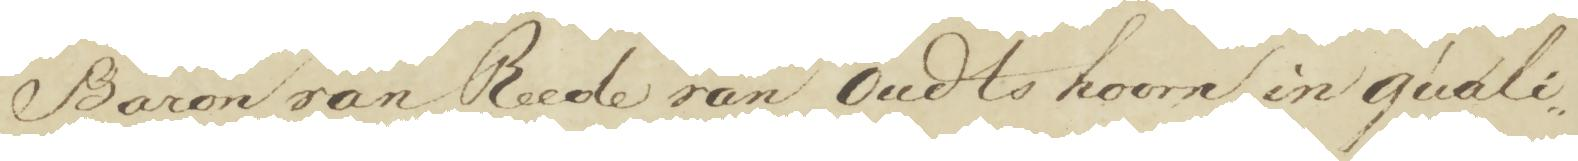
Baron van Reede van Oudts hoorn, in quali„
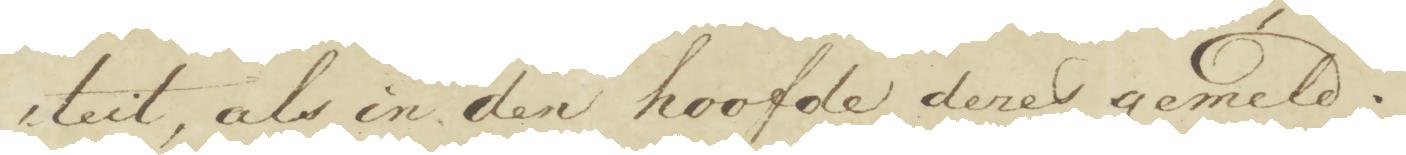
„teit, als in den hoofde dezes gemeld.
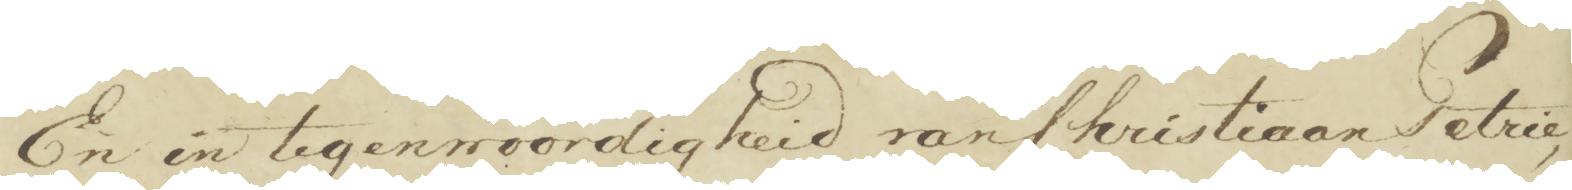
En in tegenwoordigheid van Christiaan Petrie,
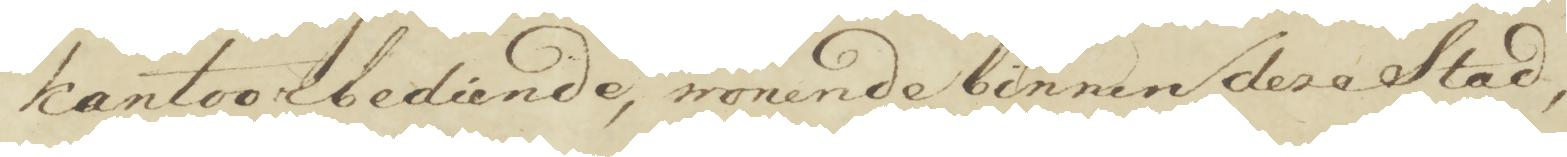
kantoorbediende, wonende binnen deze Stad,
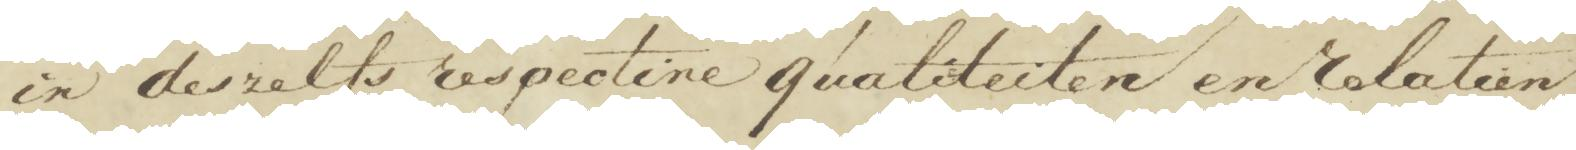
in deszelfs respective qualiteiten enrelatien
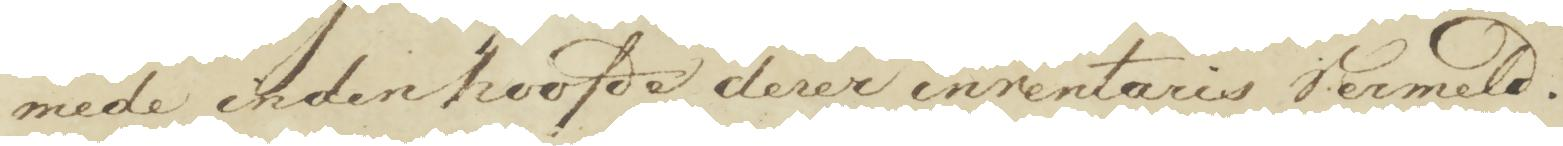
mede indenhoofde dezer inventaris vermeld.
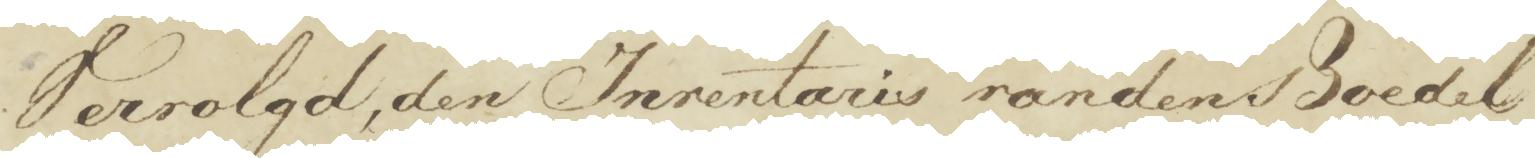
Vervolgd, den Inventaris van den Boedel
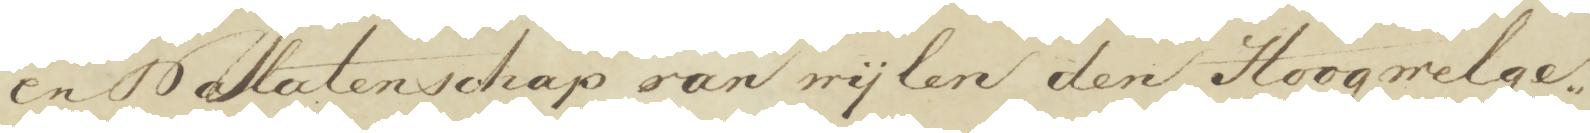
en Nalatenschap van wijlen den Hoog welge„
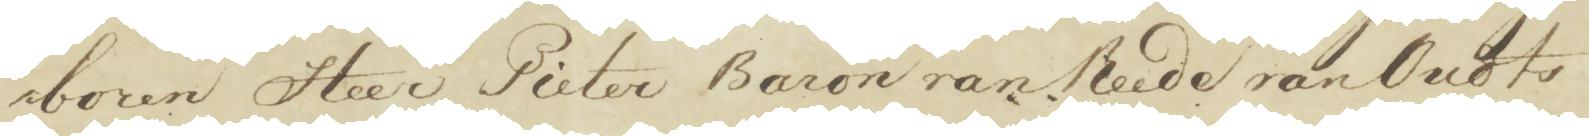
boren Heer Pieter Baron van Reede van Oudts
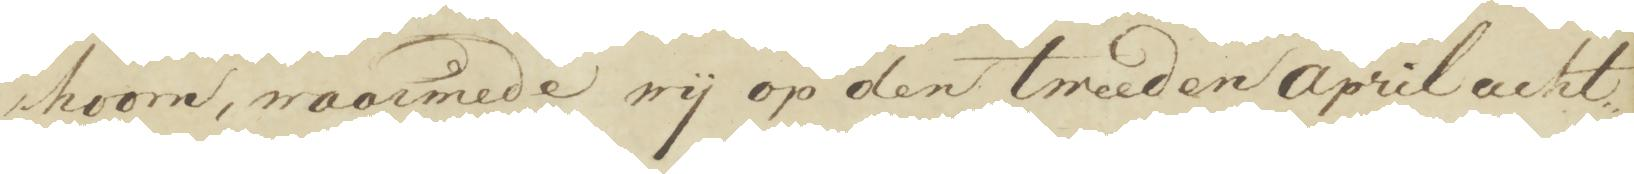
„hoom, waarmede wij op den tweeden April acht„
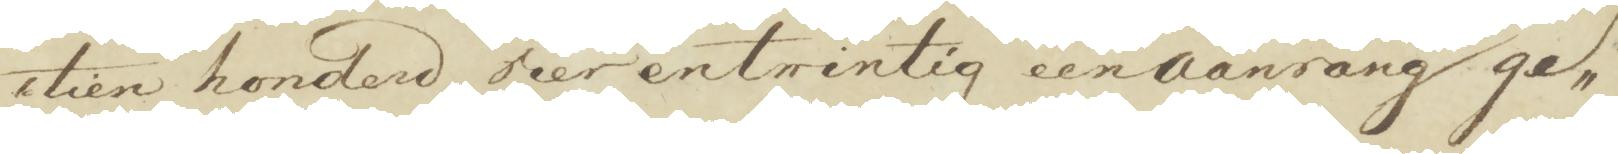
tien honderd vier entwintig eenaanvang ge„
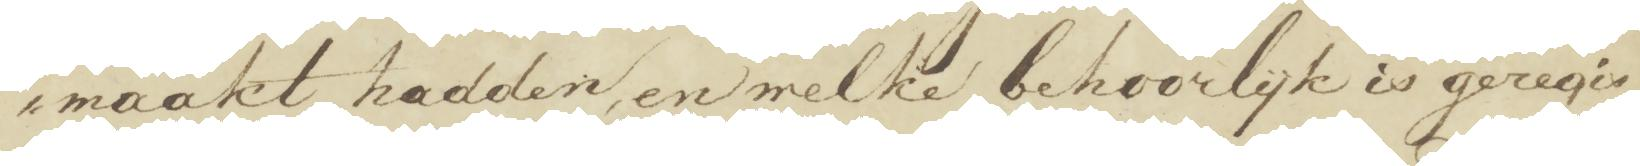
„maakt hadden, en welke behoorlijk is geregis,
